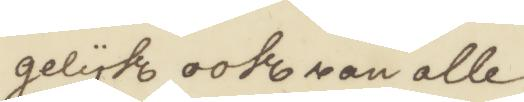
gelijk ook van alle
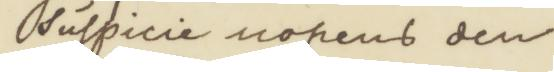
suspicie nopens den
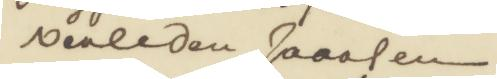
verleden Jaarsen
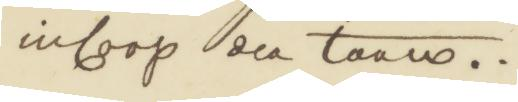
incoop der tarw.
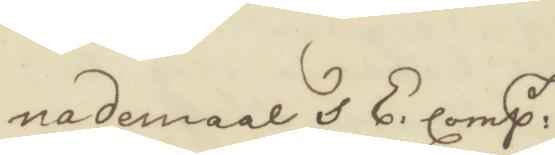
na demaal ’s E: Comp:s
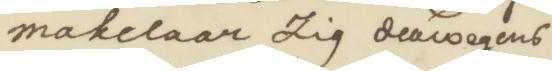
makelaar Zig derwegens
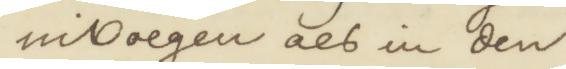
invoegen als in den
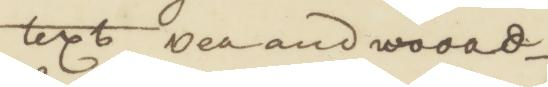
text verandwoord
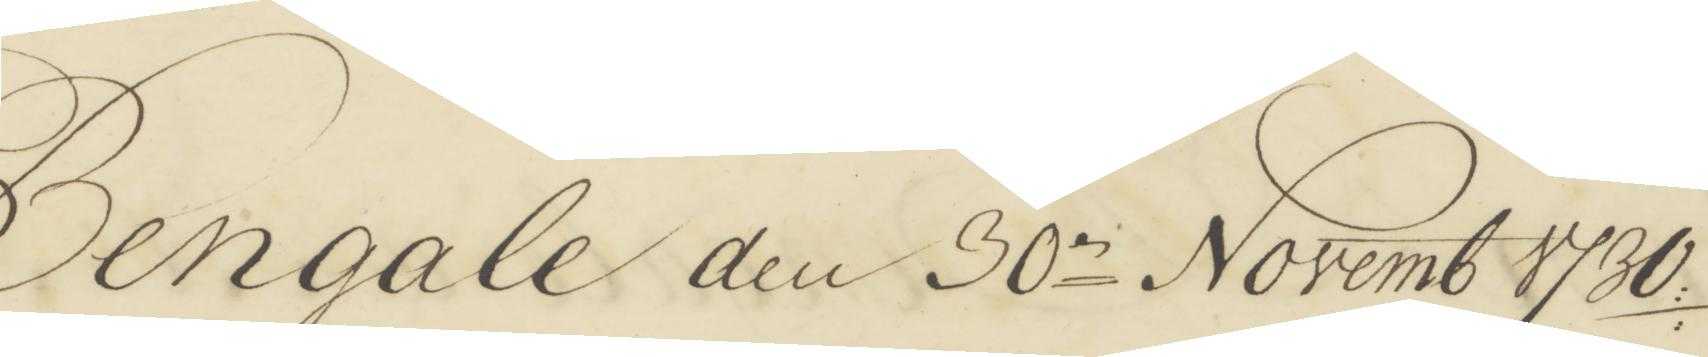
Van Bengale den 30=en Novemb 1730:
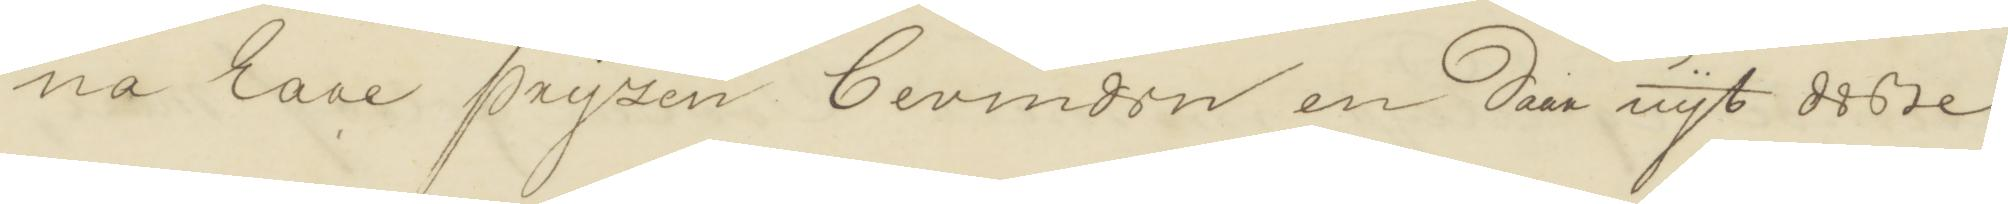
na hare prijzen bevinden en daar uijt deste
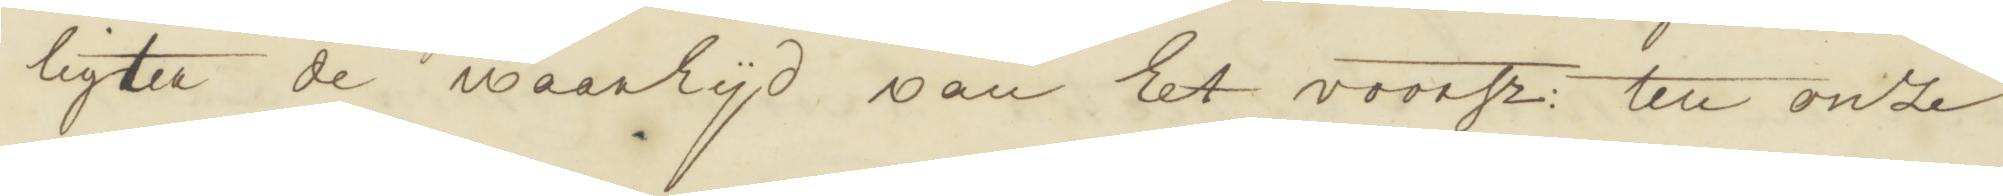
ligter de waarhijd van het voorsz: ten onze
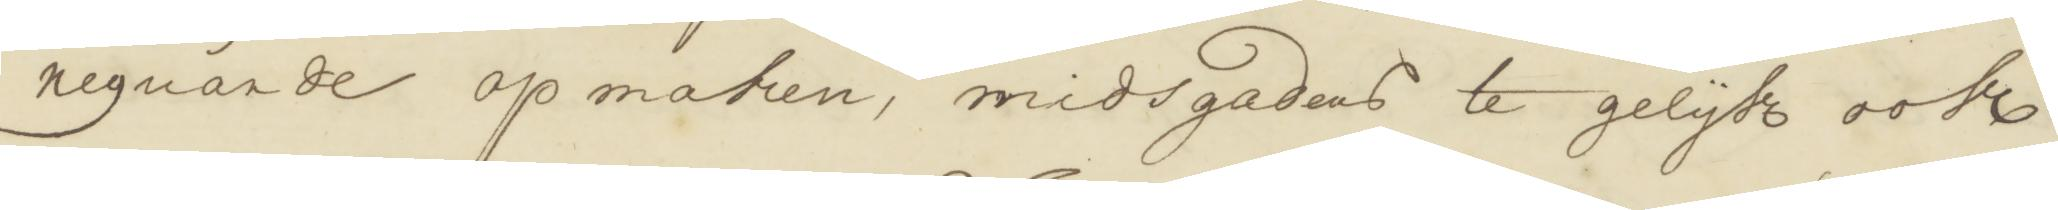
reguarde opmaken, midsgaders te gelijk ook
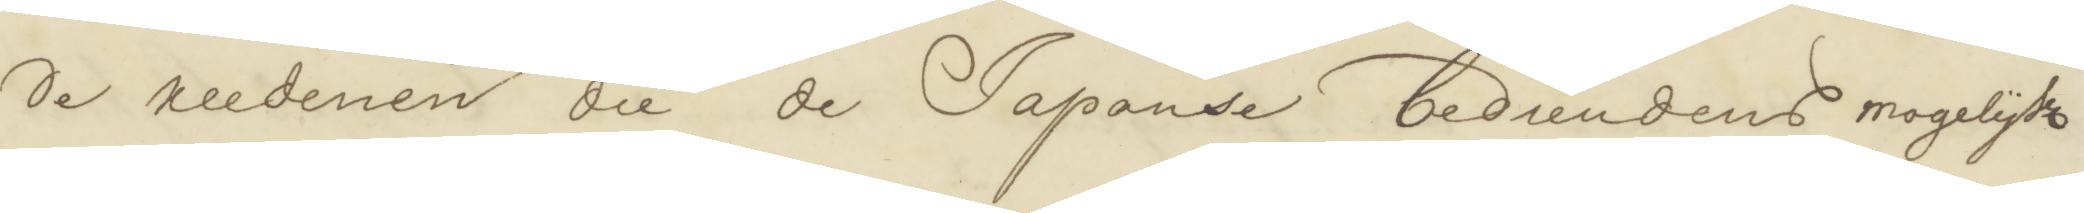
de reedenen die de Iapanse bediendens mogelijk
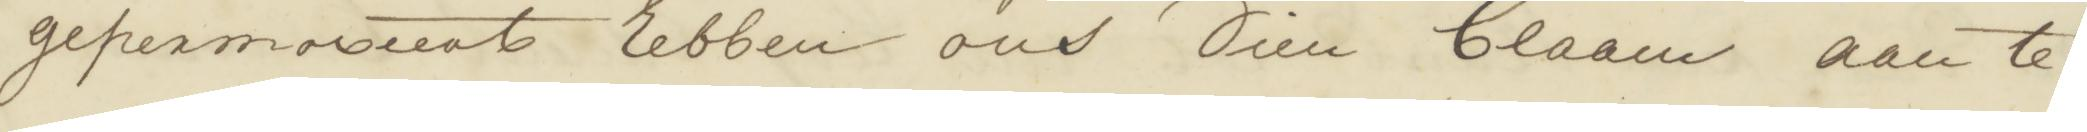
gepermoveert hebben ons dien blaam aan te
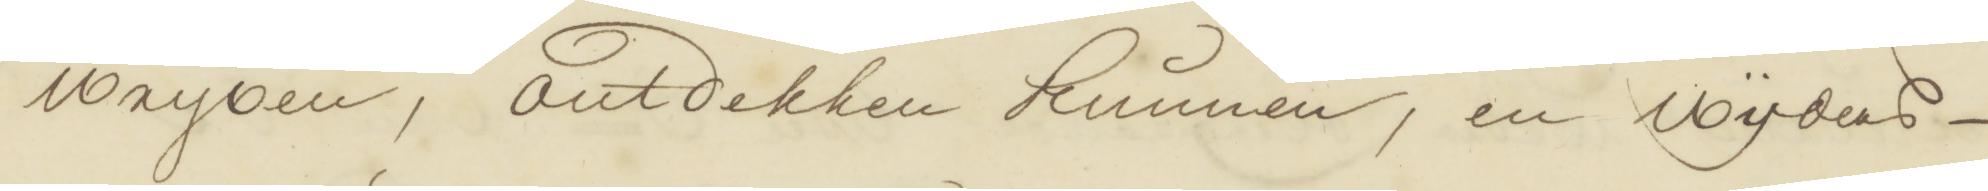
wrijven, ontdekken kunnen, en wijders
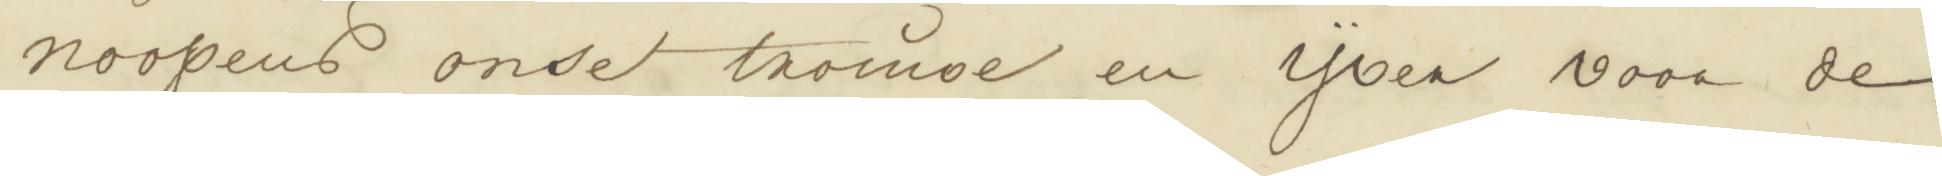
noopens onse trouwe en ijver voor de
